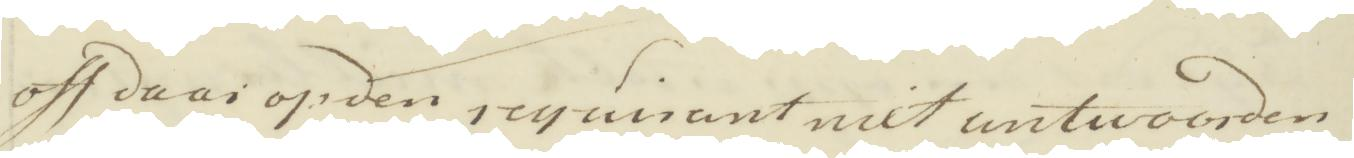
off daar op den requirant niet antwoorden
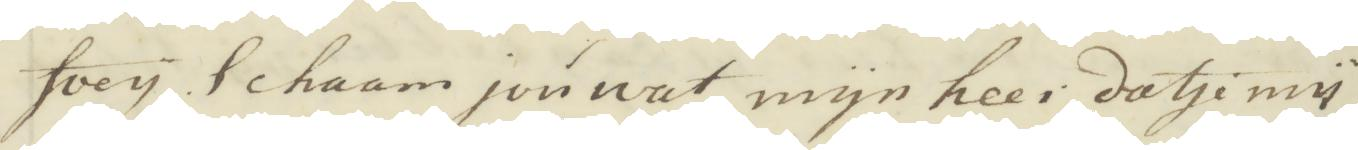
foeij schaam jou wat, mijn heer datje mij
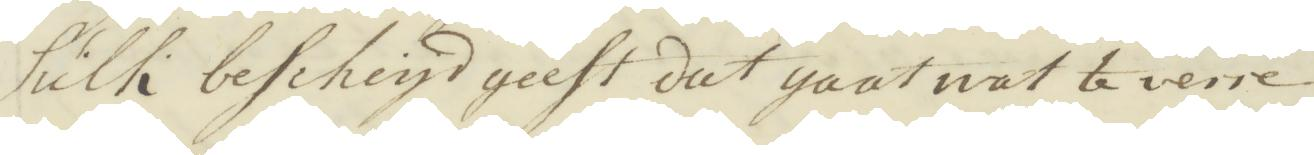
sulk bescheijd geeft dat gaat wat te verre
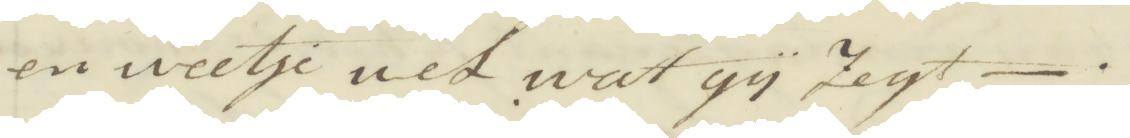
en weetje wel wat gij zegt —.
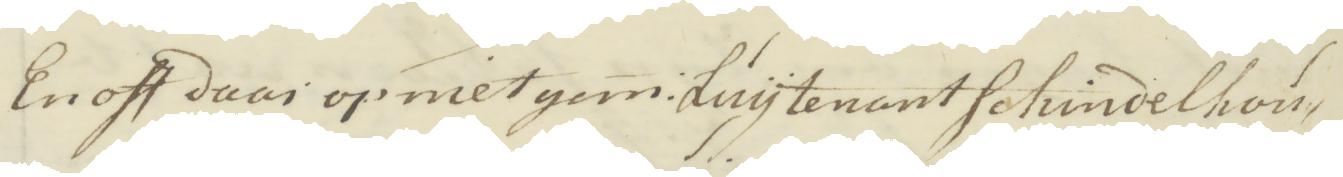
En off daar op niet gem: Luijtenant Schindelhou„
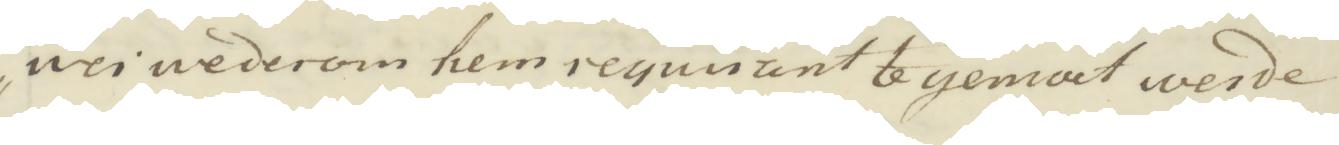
„wer wederom hem requirant te gemoet werde
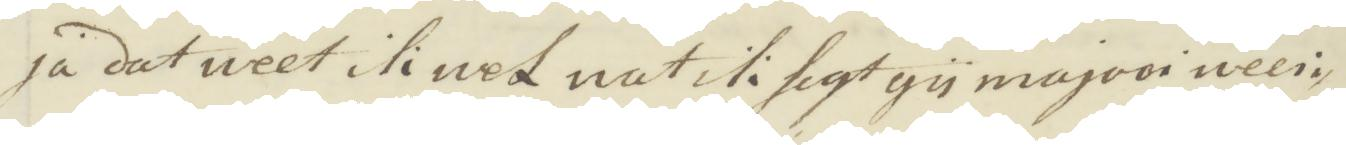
ja dat weet ik wel wat ik segt gij majoor weer
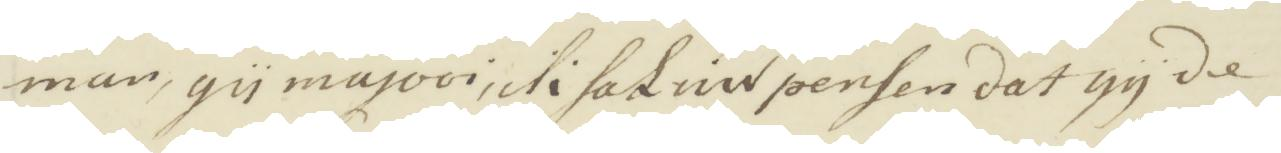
man, gij majoor, ik sal uw persen dat gij de
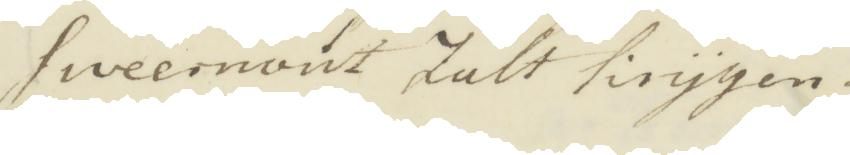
sweernout zult krijgen—.
